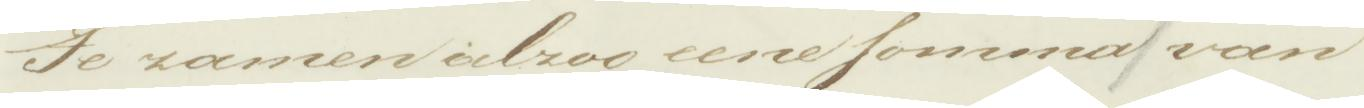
Te zamen alzoo eene somma van
